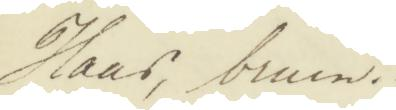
Haar, bruin.
